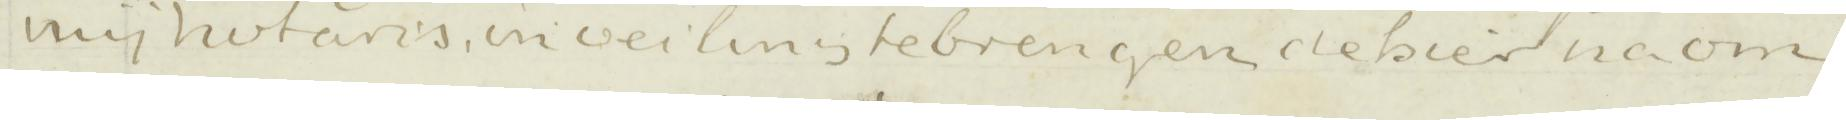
mij notaris, in veiling te brengen de hier na om
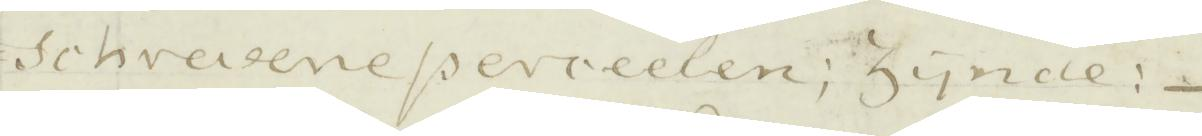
schrevene perceelen, zijnde:
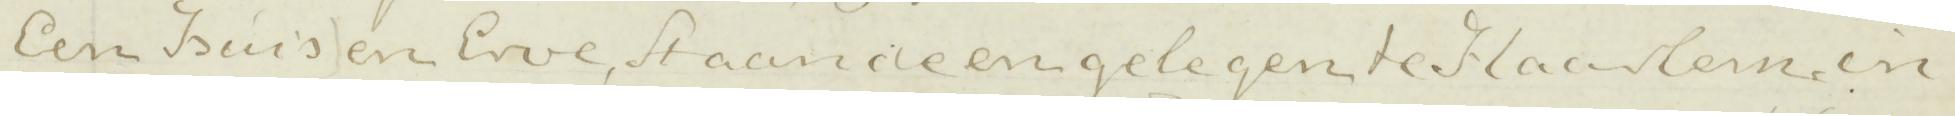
Een huis en Erve, staande en gelegen te Haarlem, in
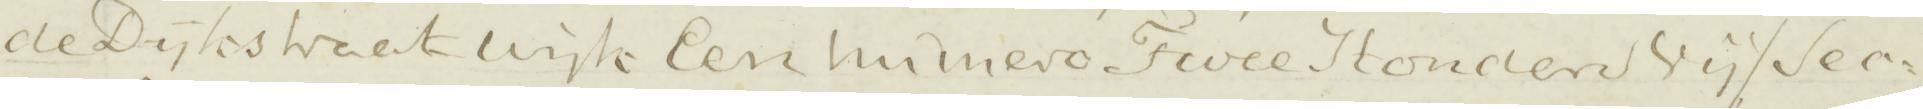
de Dijkstraat wijk Een Numero Twee Honderd Vijf Sec=
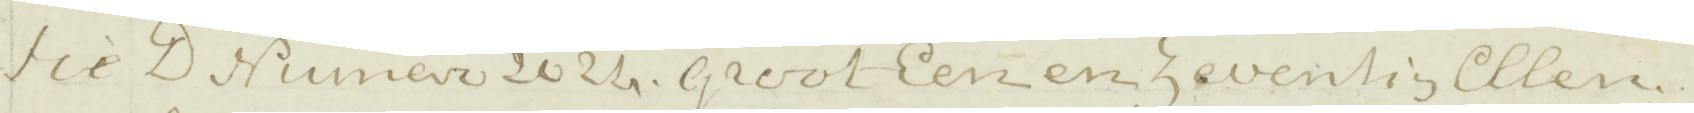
tie D Numero 2024. Groot Een en Zeventig Ellen.
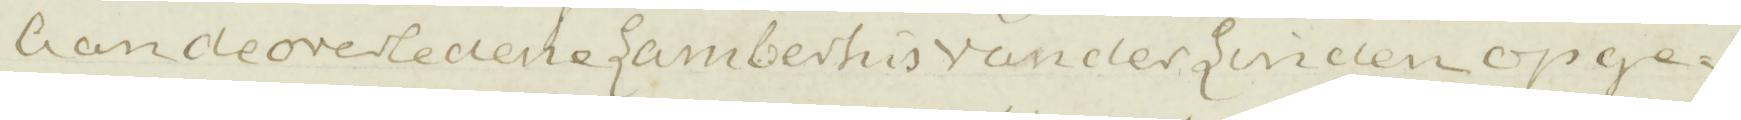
Aan de overledene Lambertus van der Linden opge=
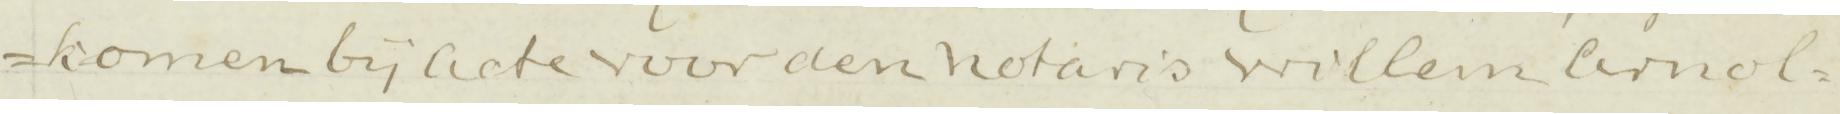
=komen bij Acte voor den notaris willem Arnol=
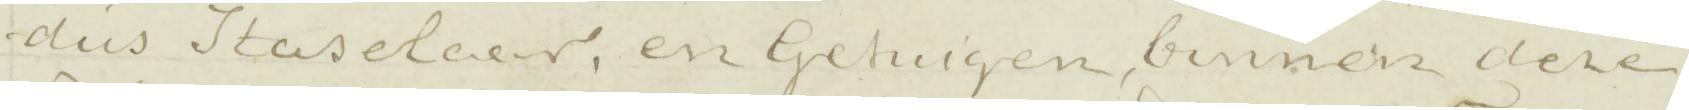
-dus Haselaar, en Getuigen, binnen deze
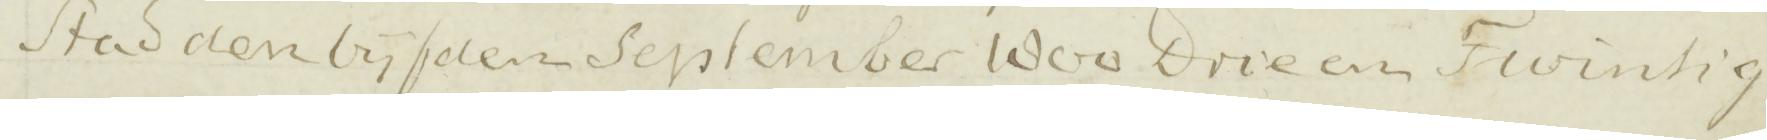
Stad den vijfden September 1800 Drie en Twintig
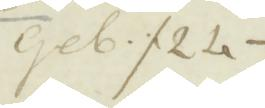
geb. ƒ24
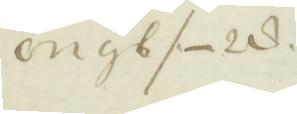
ongb ƒ—28
